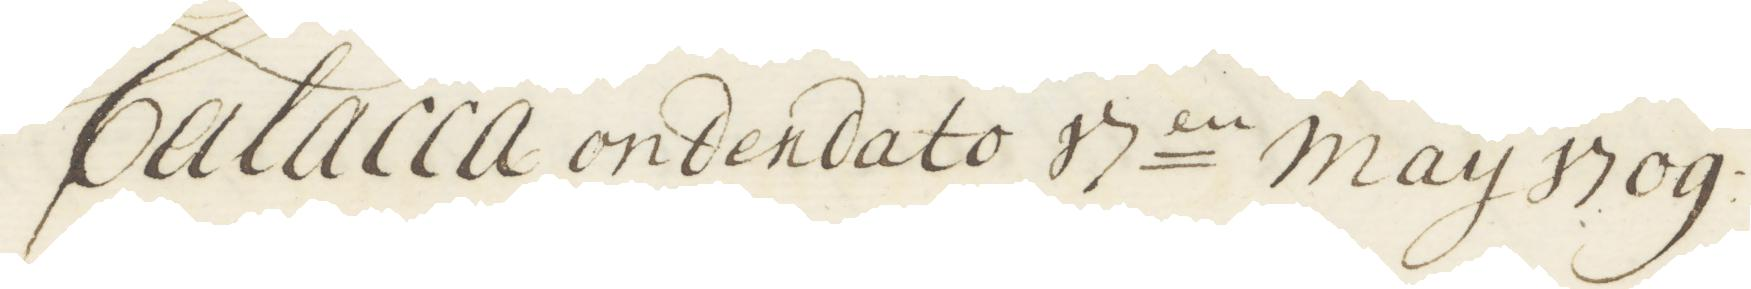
Malacca, onder dato 17=en Maij 1709:
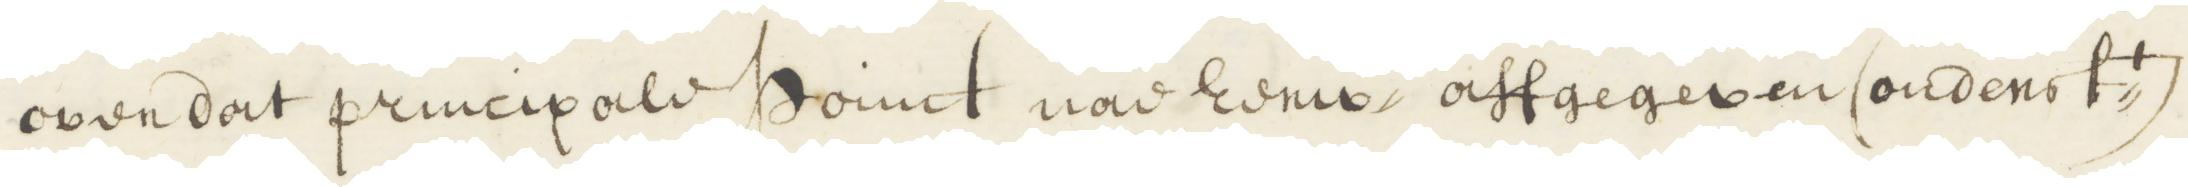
over dat principale poinct nae herw„ts affgegeven (onderst„t)
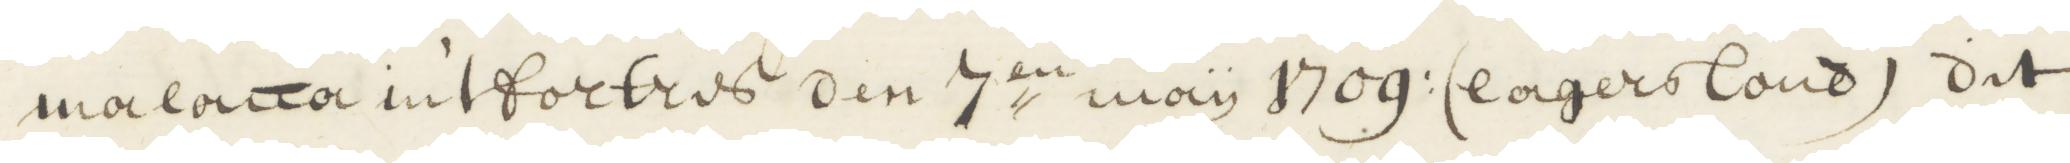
malacca in 't fortres den 7„en maij 1709: (lager stond) dit
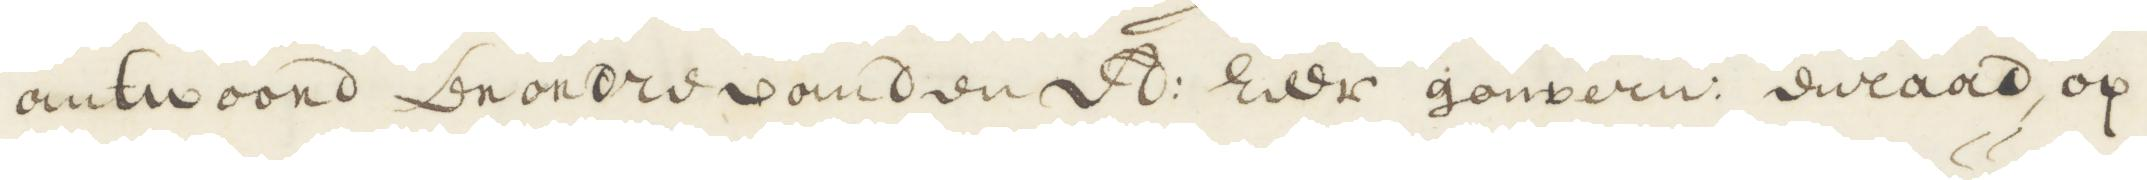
antwoord ter ordre van den Ed: heer gouvern: en raad, op
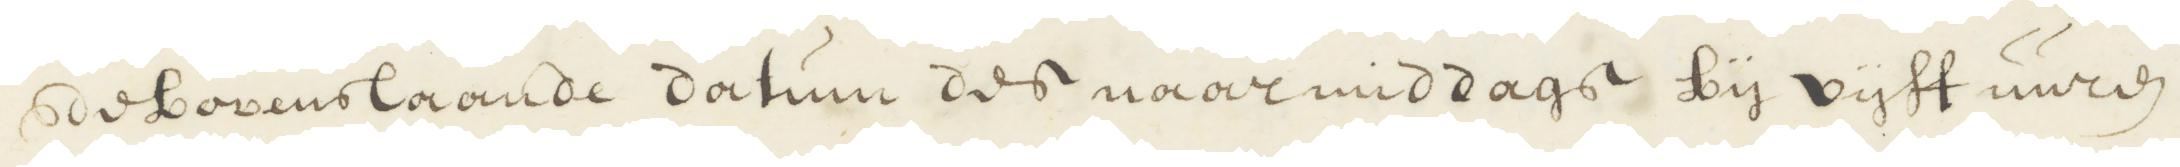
de bovenstaande datum des naarmiddags bij vijff uuren
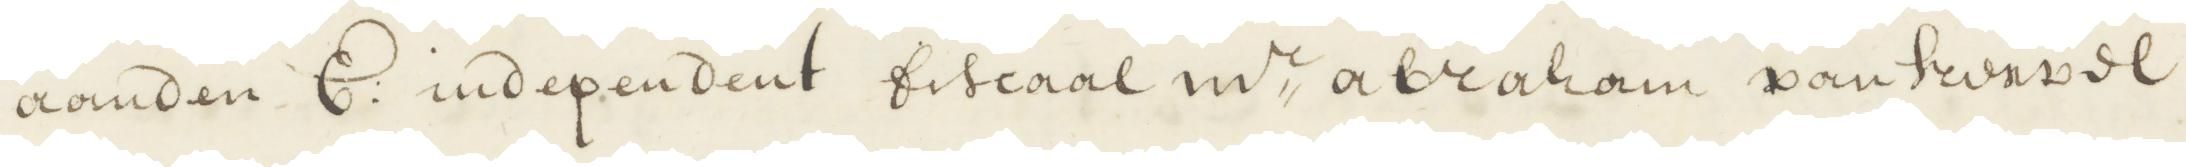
aanden E: independent fiscaal m„r abraham van kervel
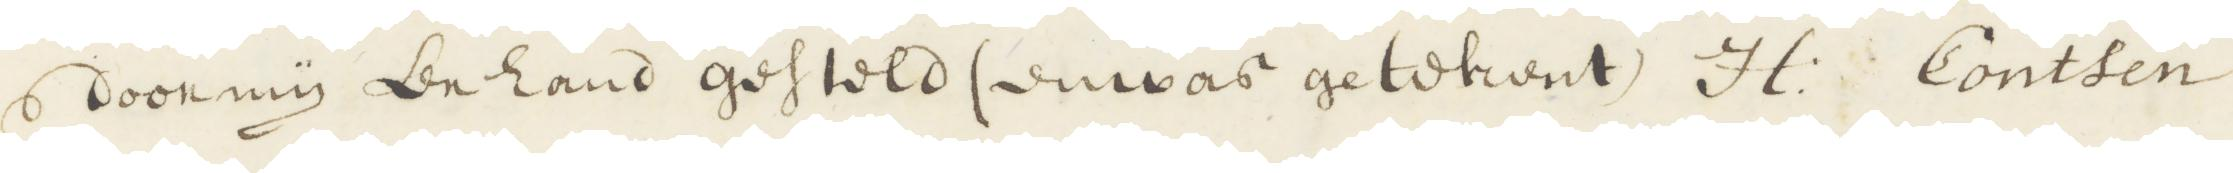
door mij ter hand gesteld (en was getekent) H: Contsen
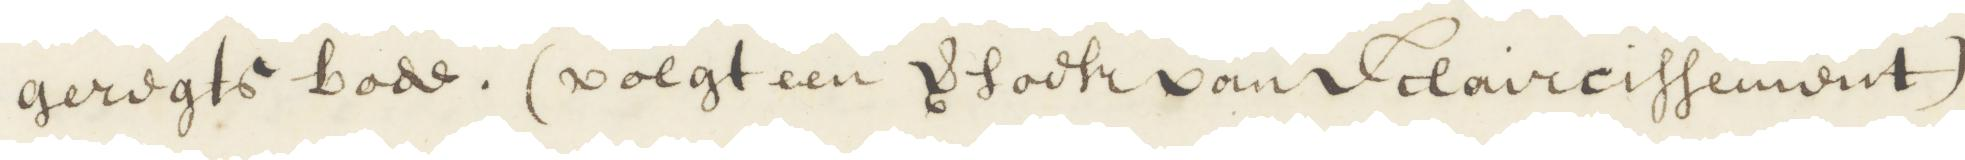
geregts bode. (volgt een versoek van Eclaircissement
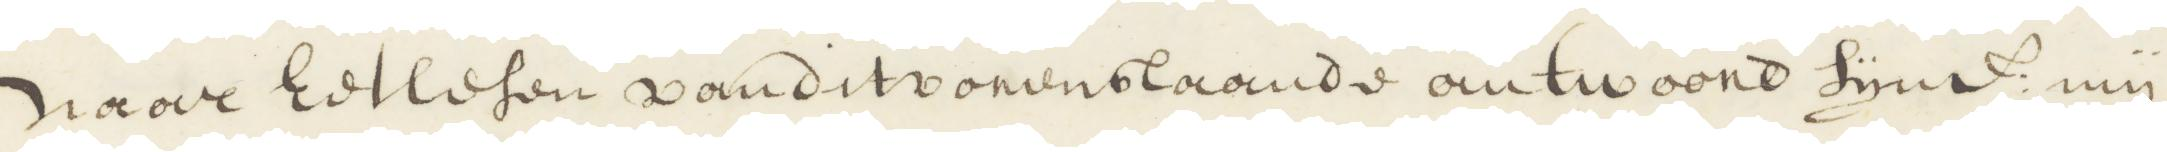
naar het lesen van dit vorenstaande antwoord sijn E: mij
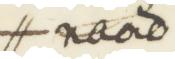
„ raa
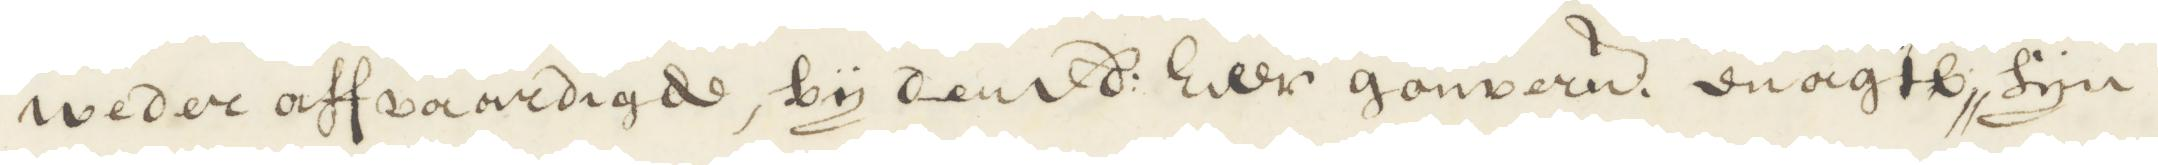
weder affvaardigde, bij den Ed: heer gouvern: en agtb „ sijn
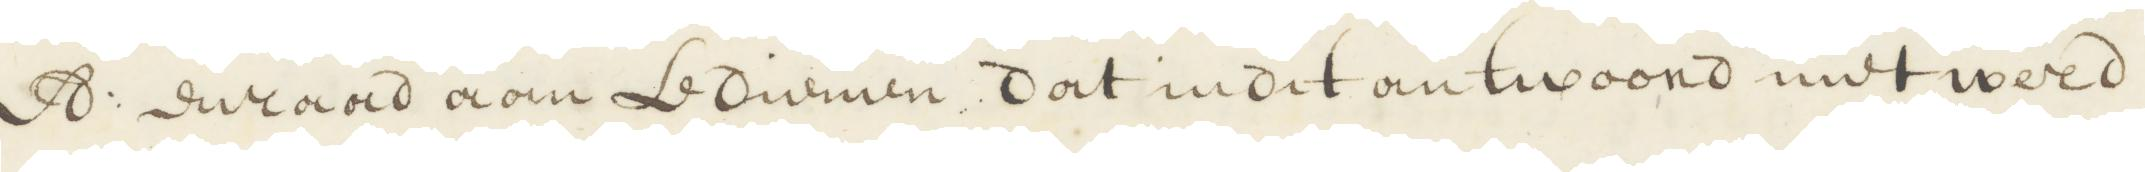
Ed: en raad aan te dienen dat in dit antwoord niet werd
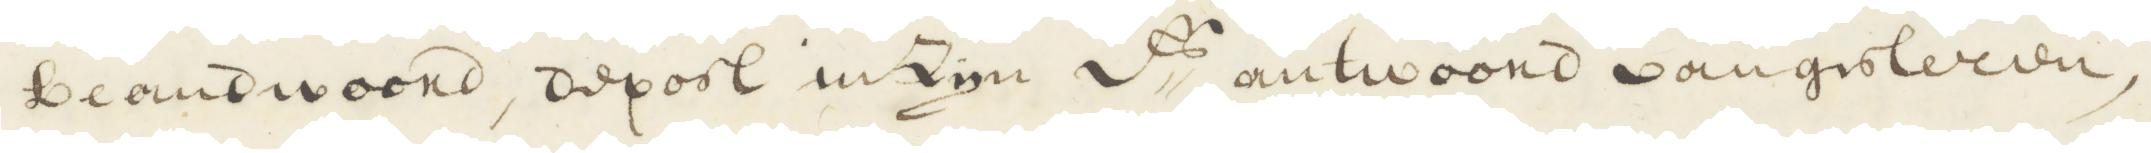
beandwoord, de post in zijn E„s antwoord van gisteren,
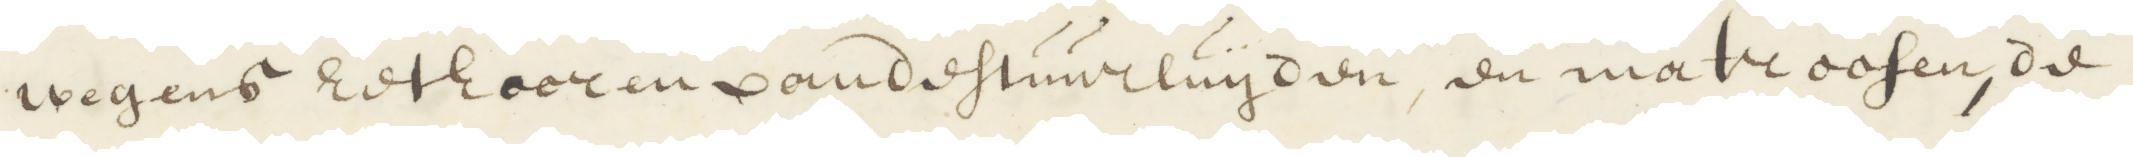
wegens het hooren vande stuurluijden, en matroosen, de
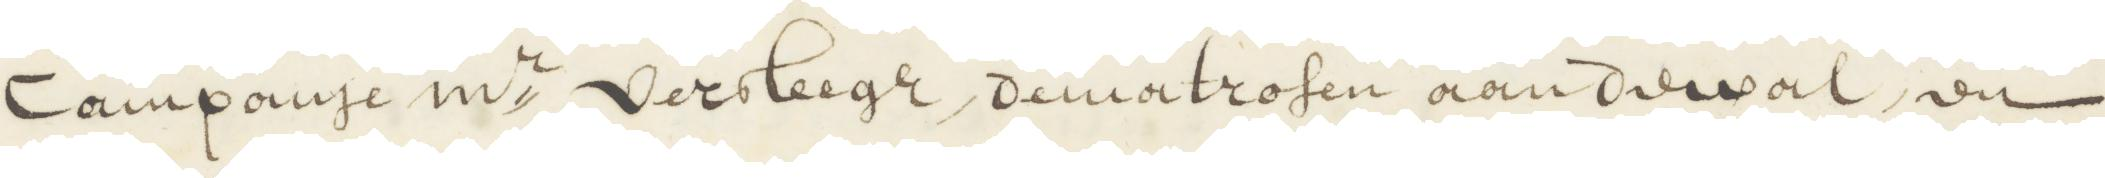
Campanje m„r versteegh, de matrosen aan de wal, en
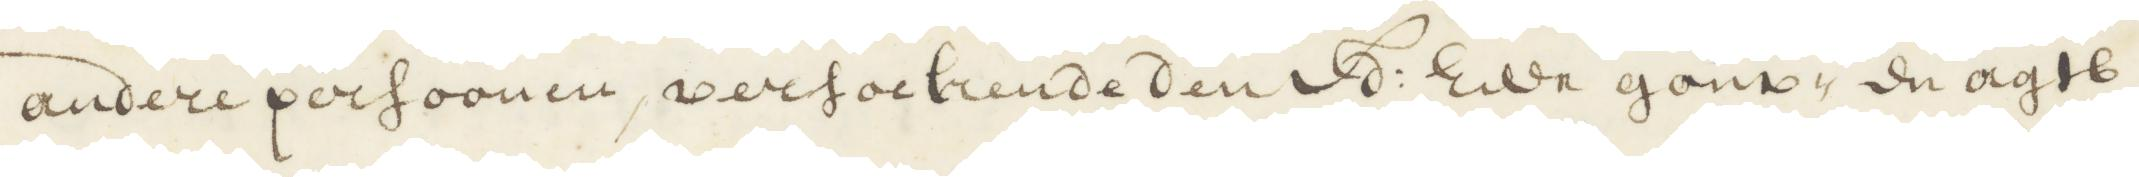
andere persoonen, versoekende den Ed: heer gouv„r en agtb
